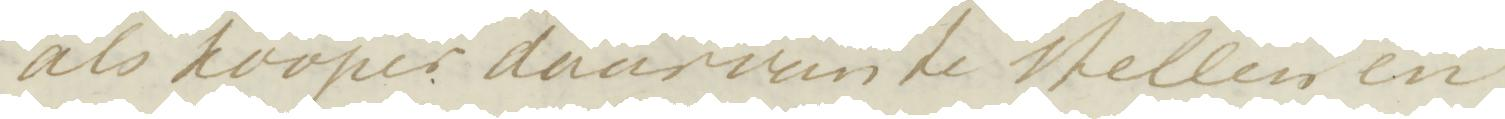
als kooper daarvan te stellen en
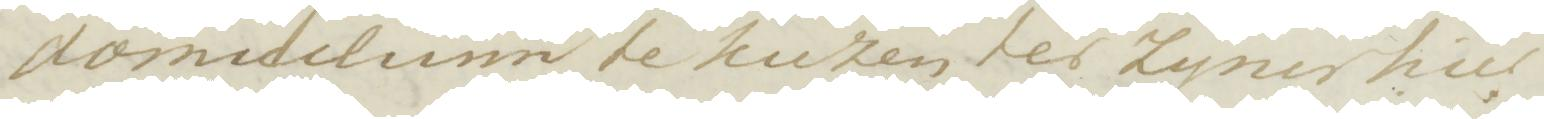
domicilium te kiezen ter zyner hier
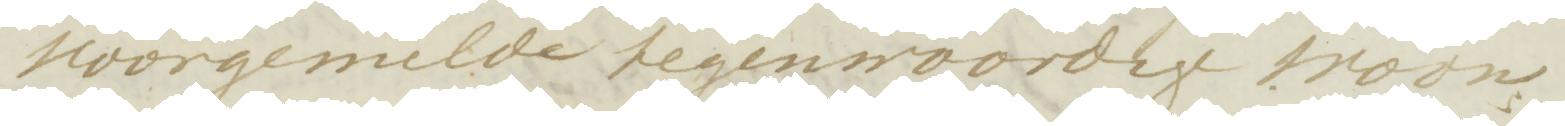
voorgemelde tegenwoordig woon„
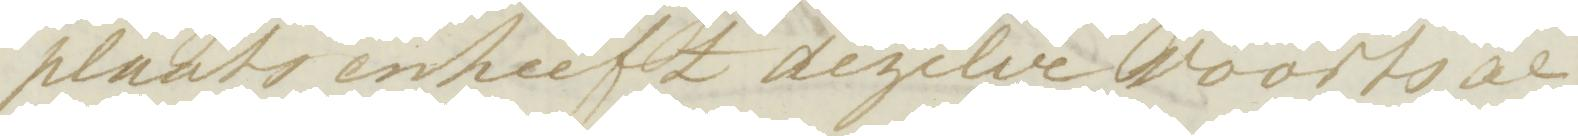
plaats en heeft dezelve voorts al
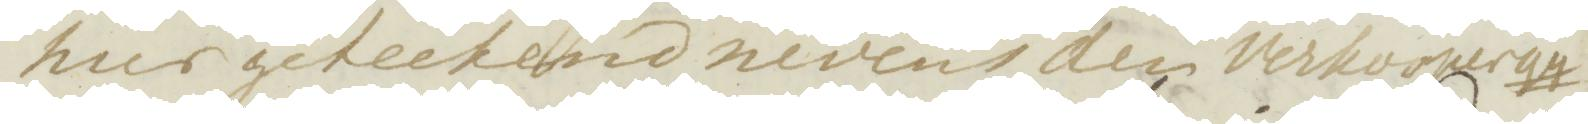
hier geteekend nevens den verkooper qq
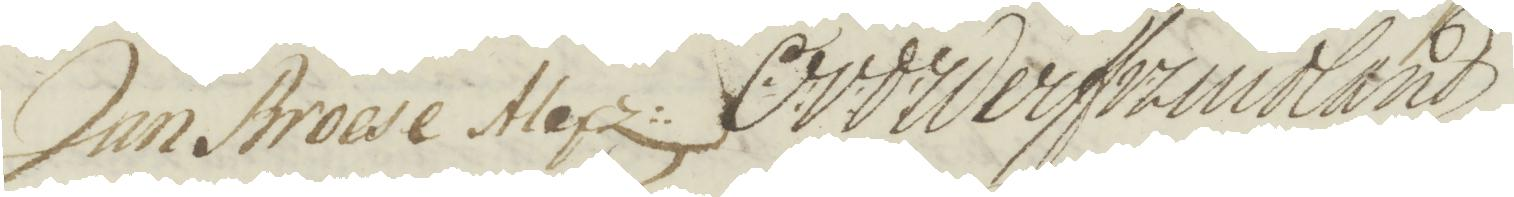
Jan Broese Alexz: C:v:d:r derff zuidland
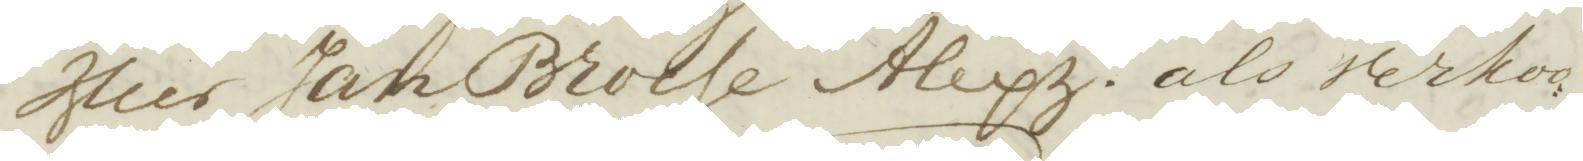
Heer Jan Broese Alexz. als verkoo„
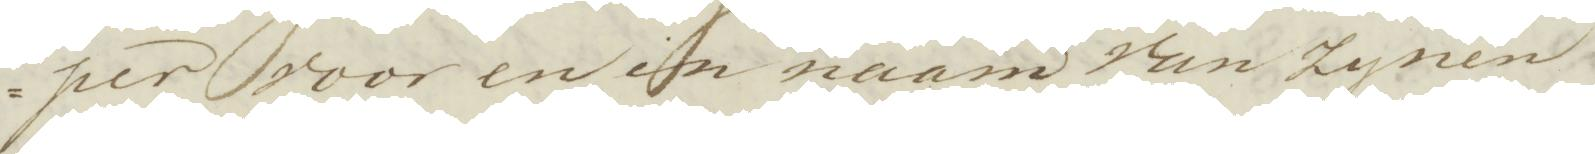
=per voor en in naam van zynen
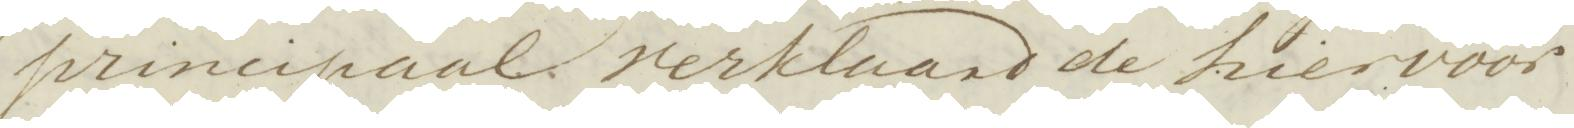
principaal verklaard de hiervoor
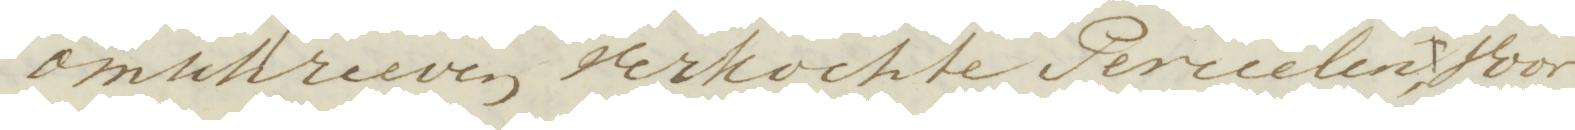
omschreeven verkochte Perceelen, voor
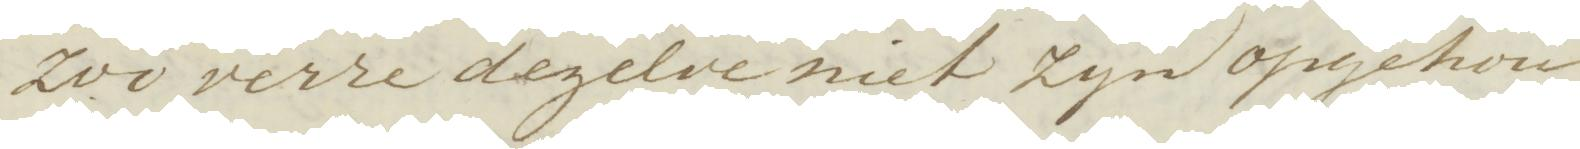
zoo verre dezelve niet zyn opgehou:
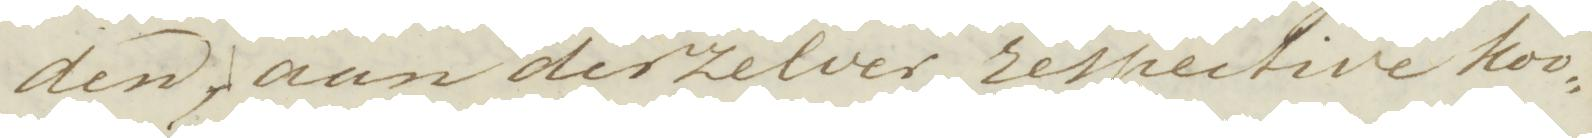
den aan derzelver respective koo=
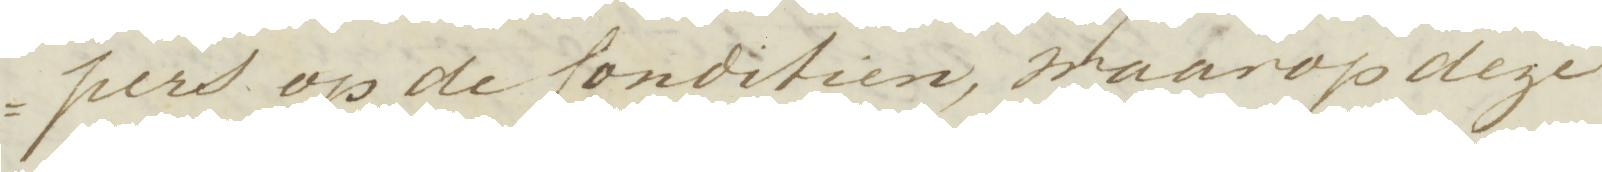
=pers op de Conditien, waarop deze
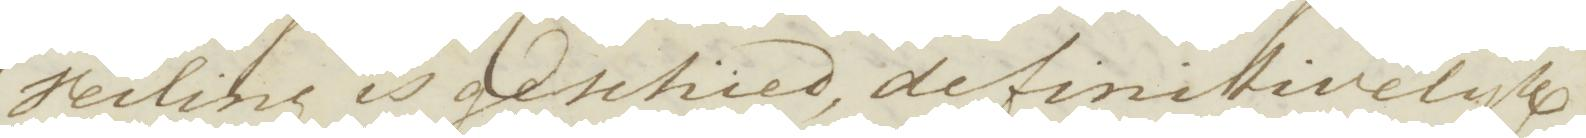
veiling is geschied, definitivelyk
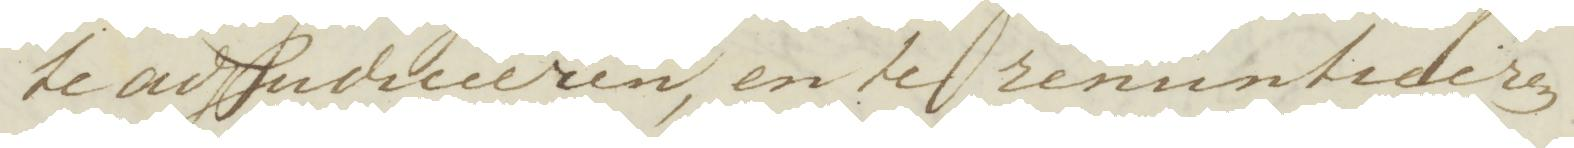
te adjudiceeren, en te renuntieeren
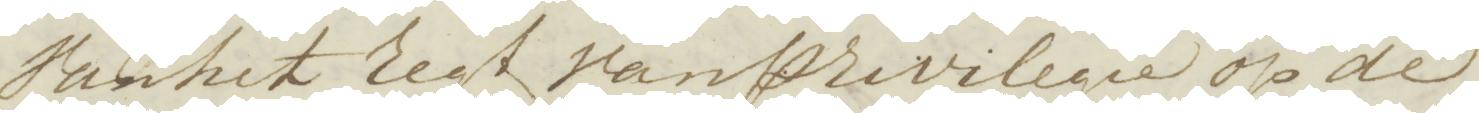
van het regt van privilegie op de
